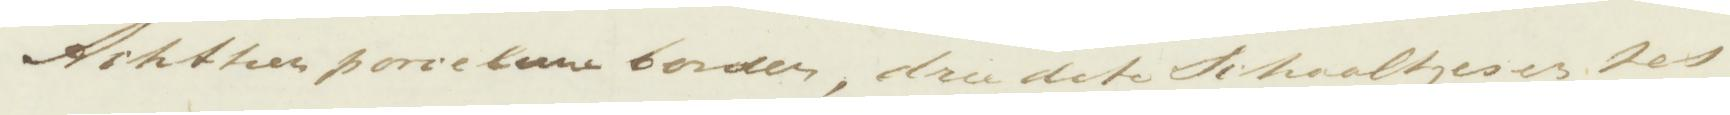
Achttien porceleine borden, drie dito Schaaltjes en zes
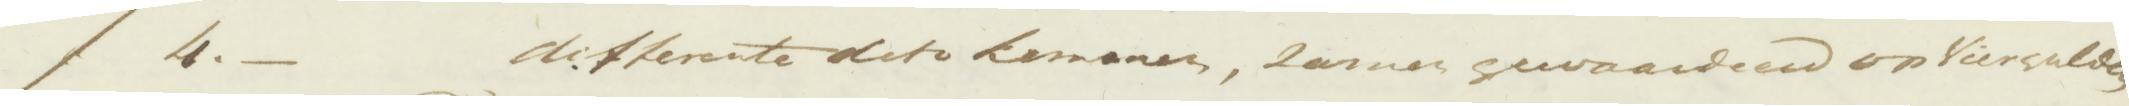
ƒ 4. — differente dito kommen, zamen gewaardeerd op Vier gulden
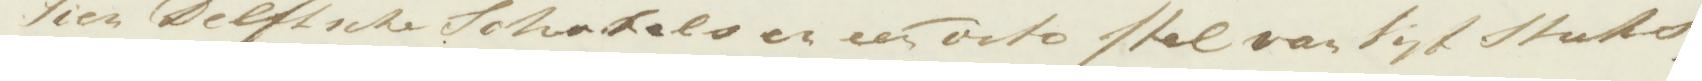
Tien Delftsche schotels en een dito stel van Vyf stuks
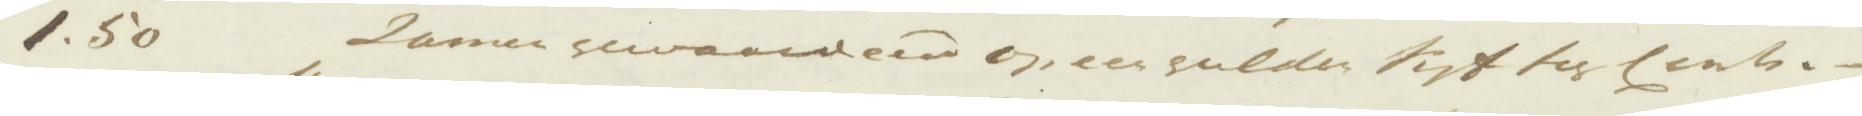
1.50 zamen gewaardeerd op een gulden Vyftig Cents.
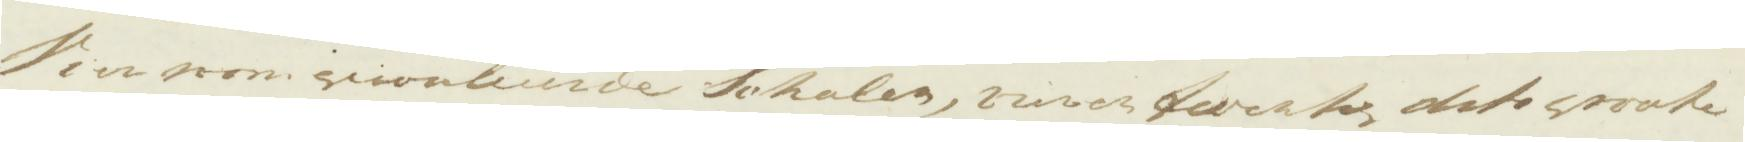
Vier room gecouleurde schalen, vieren twintig dito groote
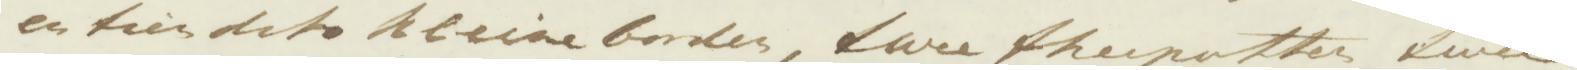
en tien dito kleine borden, twee theepotten, twee
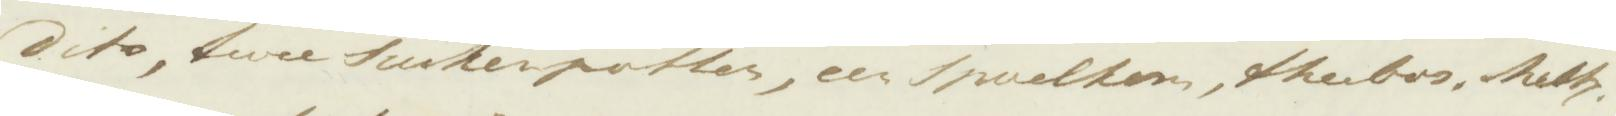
dito, twee suikerpotten, een spoelkom, theebos, Melk.
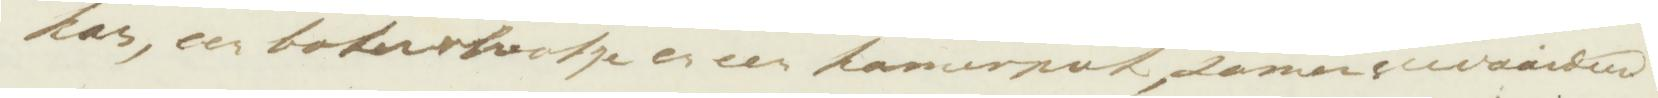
kan, een botervlootje en een kamerpot, zamen gewaardeerd
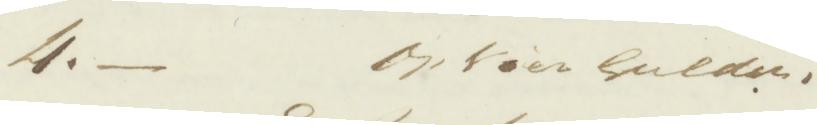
4. — op vier Gulden
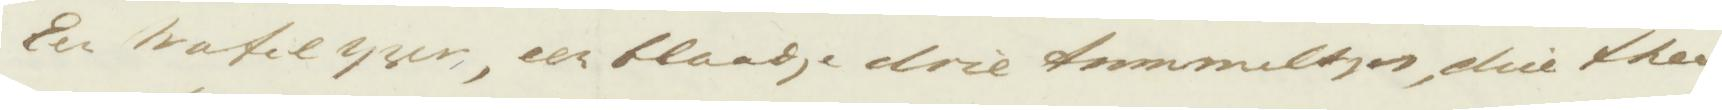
Een wafelijzer, een blaadje drie trommeltjes, drie thee
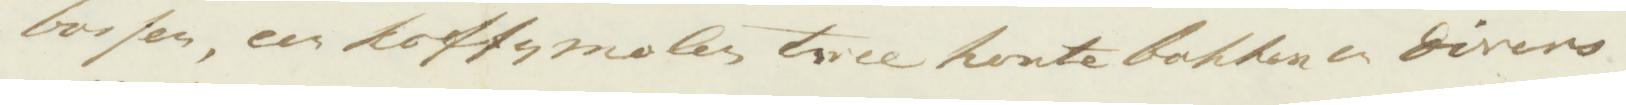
bossen, een koffijmolen twee houte bokken en divers
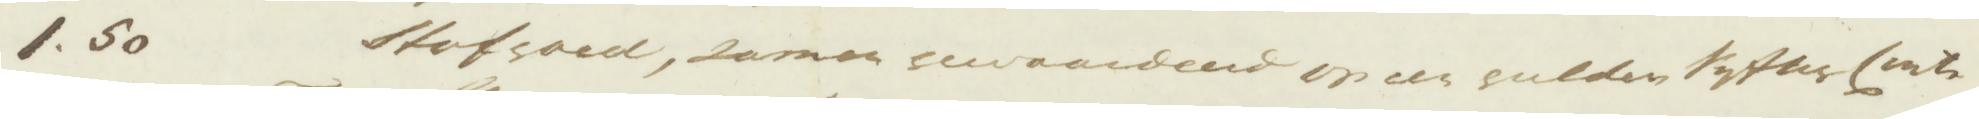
1. 50 stofgoed, zamen gewaardeerd op een gulden Vyftig Cents
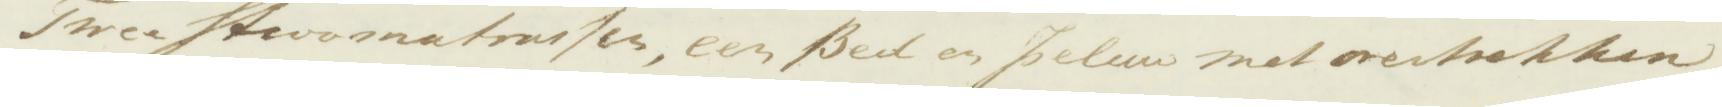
Twee stroomatrassen, een Bed en peluw met overtekken,
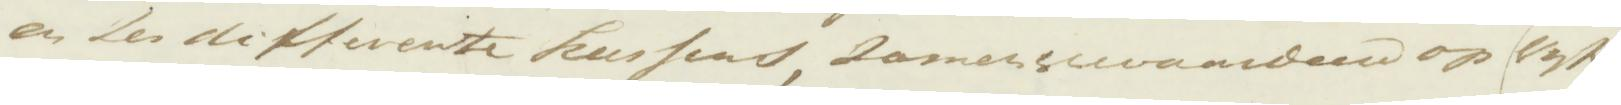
en zes differente kussens, zamen gewaardeerd op vyf
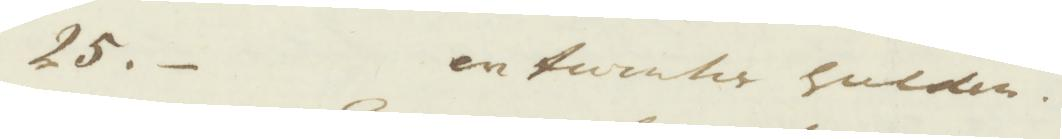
25. — en twintig gulden.
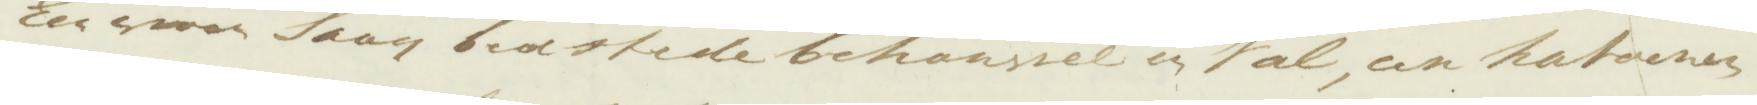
Een groen Saay bedstede behangsel en Val, een katoenen
